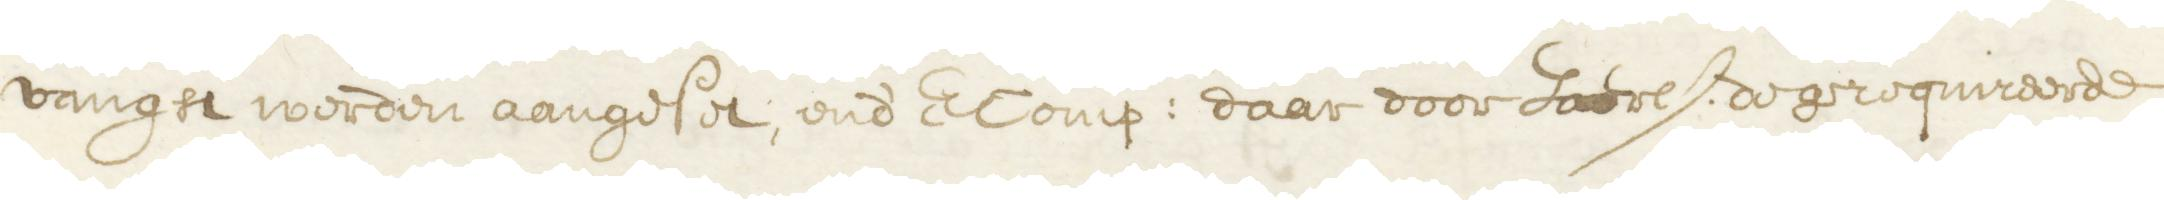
vangst werden aangeset, en d' E Comp:e daar door Iaerlijk degerequireerde
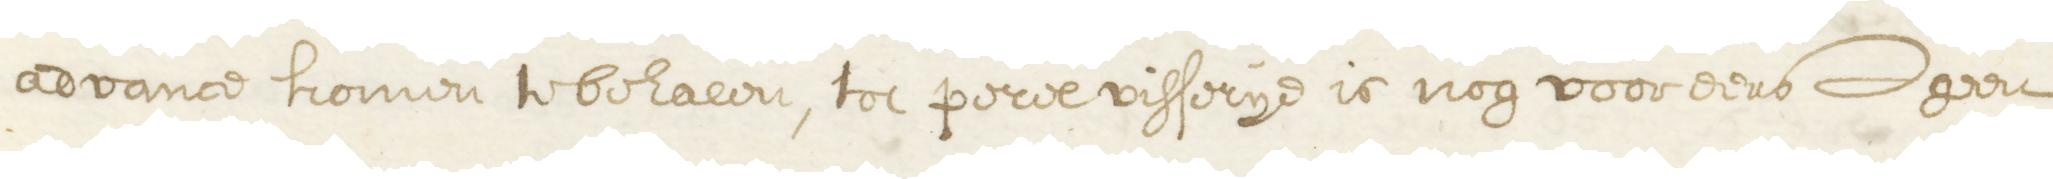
advance komen te behalen, tot perelvisserije is nog voor eerst geen
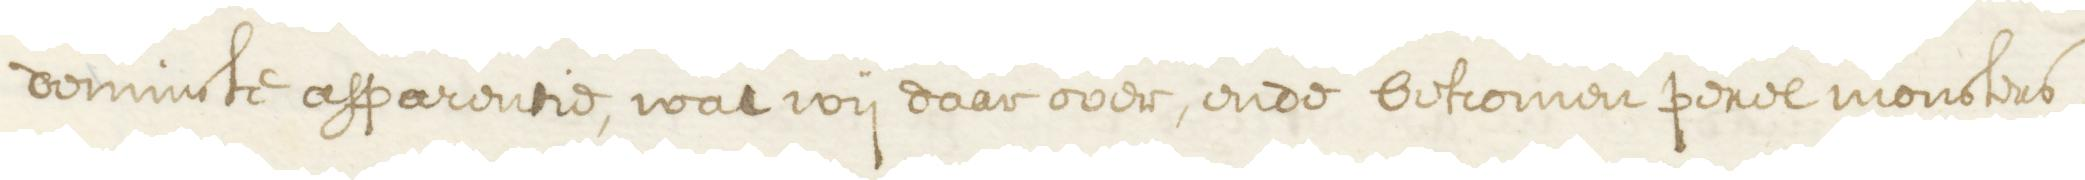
deminste apparentie, wat wij daar over, ende bekomen perel monsters
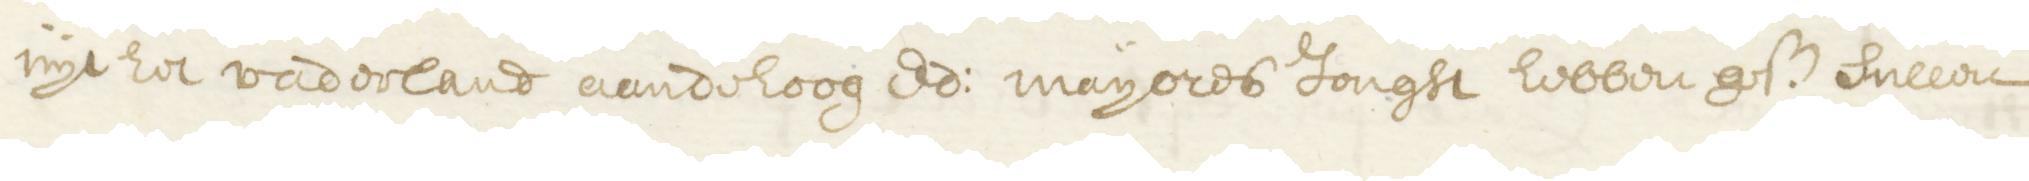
uijt het vaderland aan de hoog Ed: maijords Iongst hebben gelijk sullen
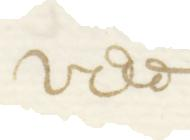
VEd
